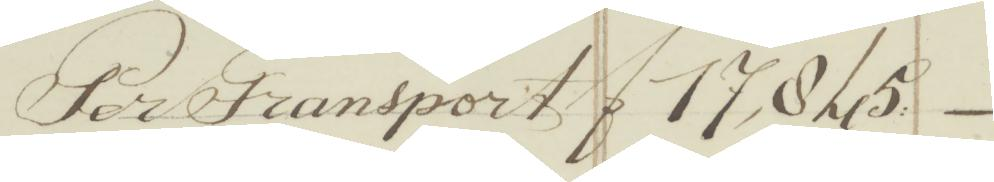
Per Transport ƒ 17,845: —
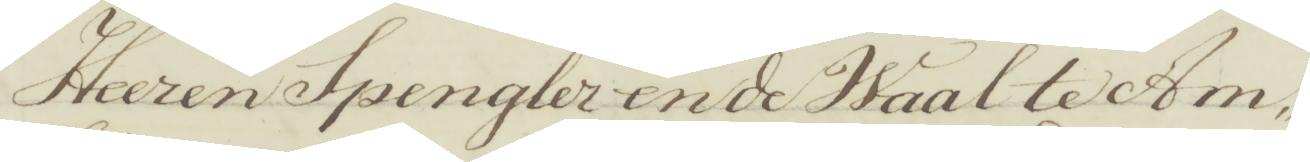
Heeren Spengler en de Waalte Am„
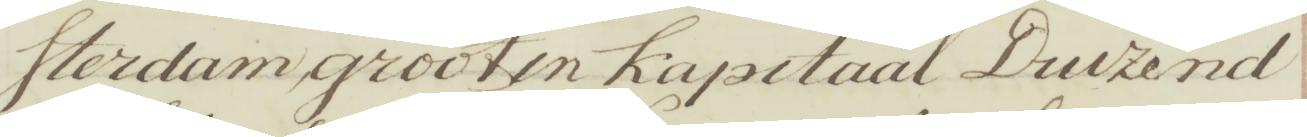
sterdam, groot en kapitaal Duizend
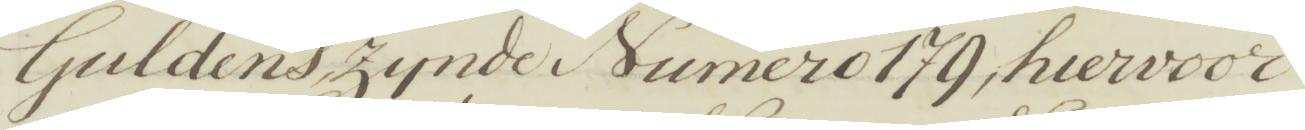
Guldens, zynde Numero 179, hiervoor
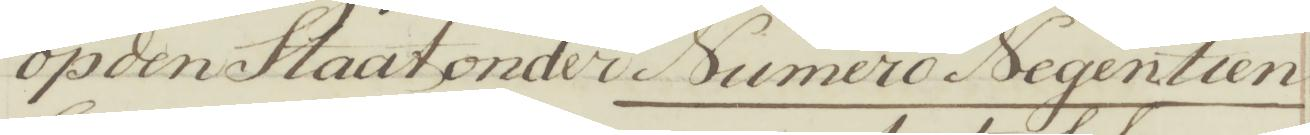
op den Staat onder Numero Negentien
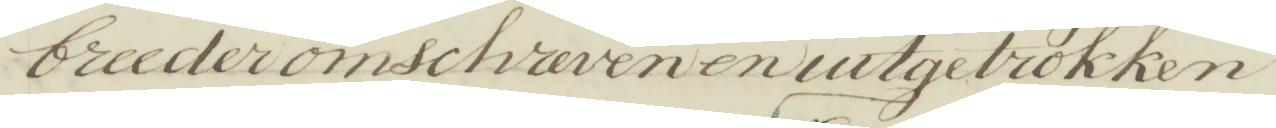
breeder omschreven en uitgetrokken
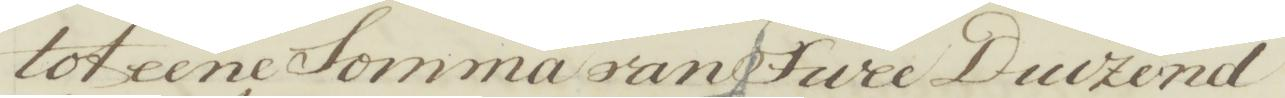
tot eene Somma van / Twee Duizend
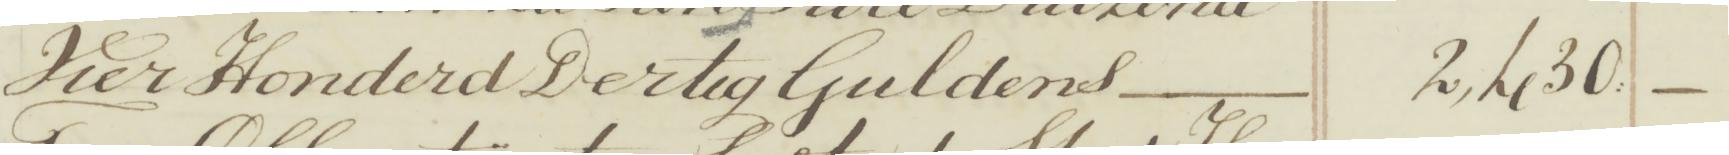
Vier Honderd Dertig Guldens — 2,430: —
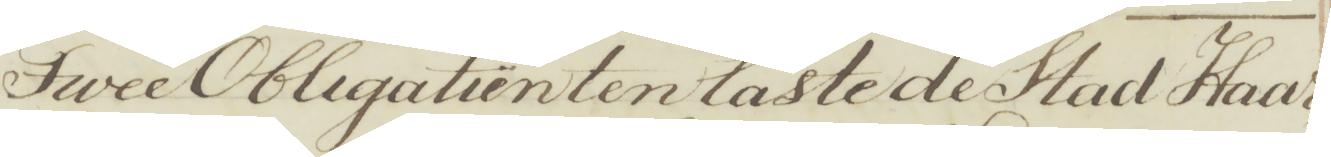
Twee Obligatien ten laste de Stad Haar
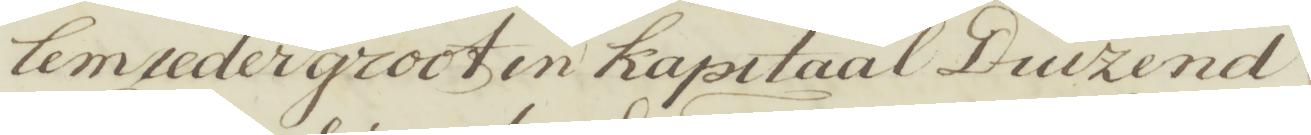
lem ieder groot in Kapitaal Duizend
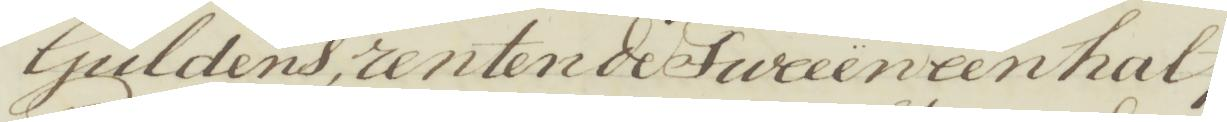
Guldens, rentende Tweeën een half
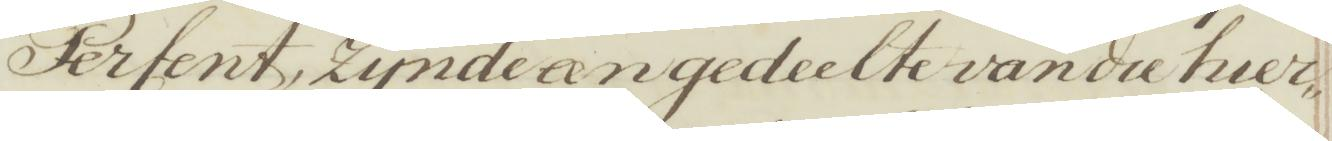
Percent, zynde een gedeelte van die hier
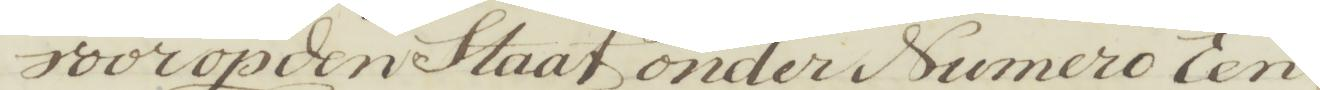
voor op den Staat onder Numero Een
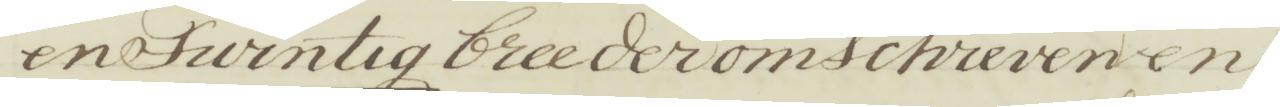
en Twintig breeder omschreven en
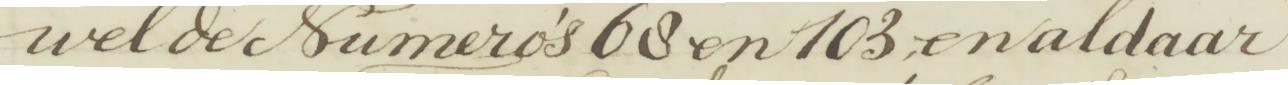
wel de Numeros 68 en 103, en aldaar
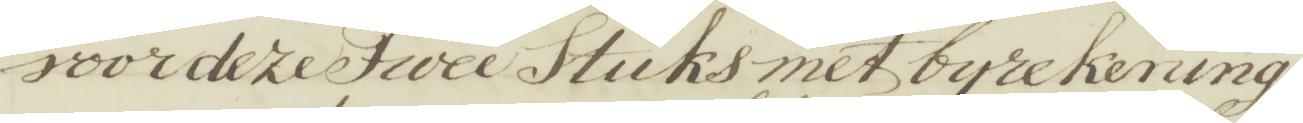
voor deze Twee Stuks met byrekening
